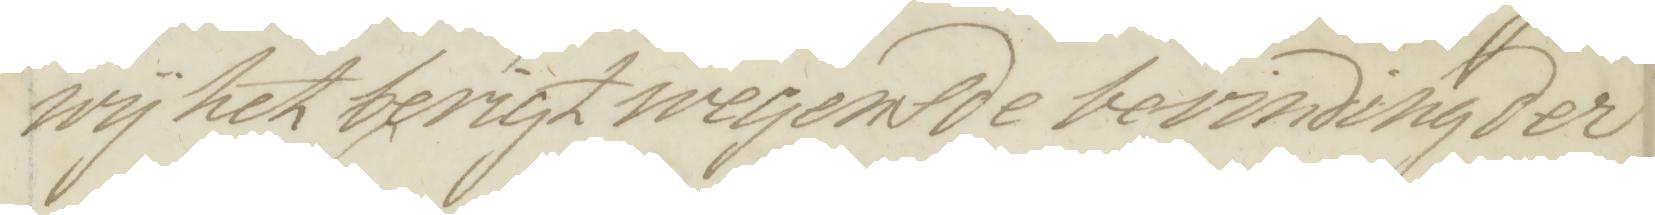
wij het berigt wegens de bevinding der
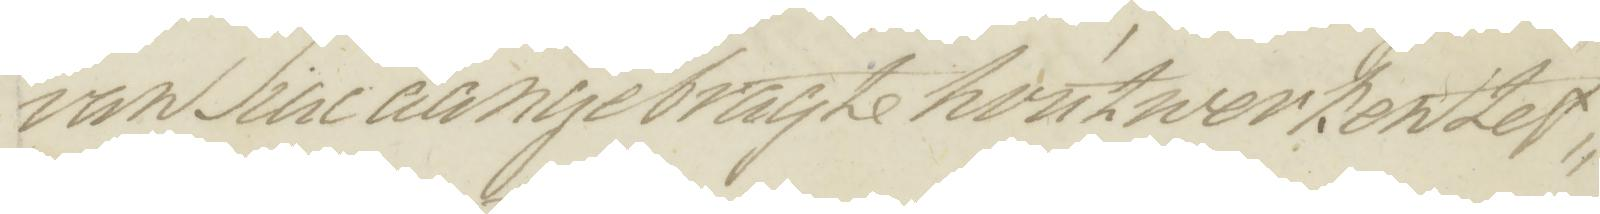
van Siac aangebragte houtwerken tef
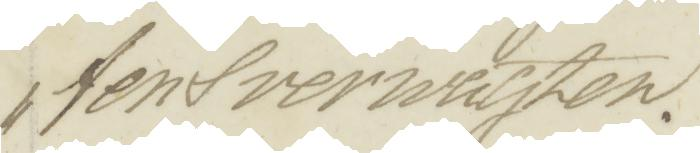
fens verwagten.
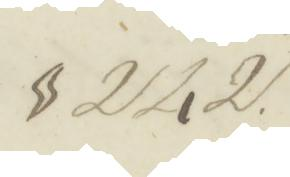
SS 242.
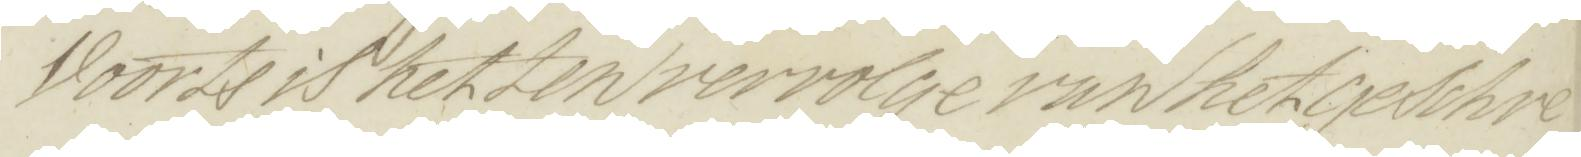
Voorts is het ten vervolge van het geschre
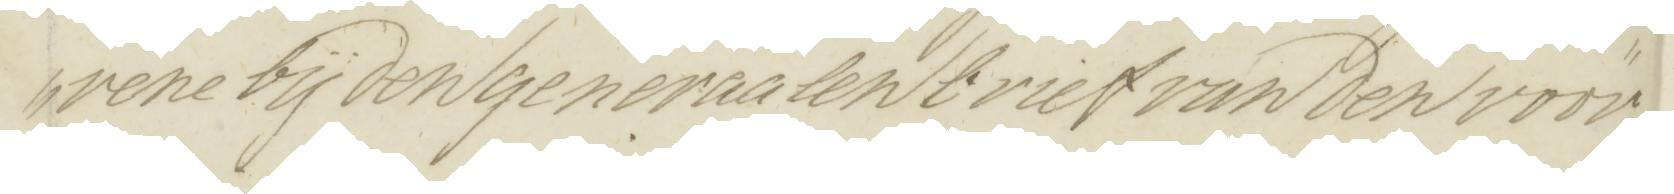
„vene bij den generaa len brief van den voor„
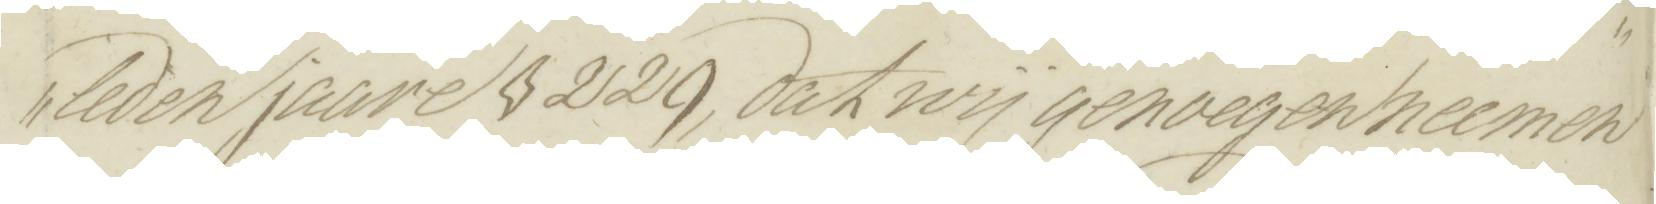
„leden jaare SS 229, dat wij genoegen neemen
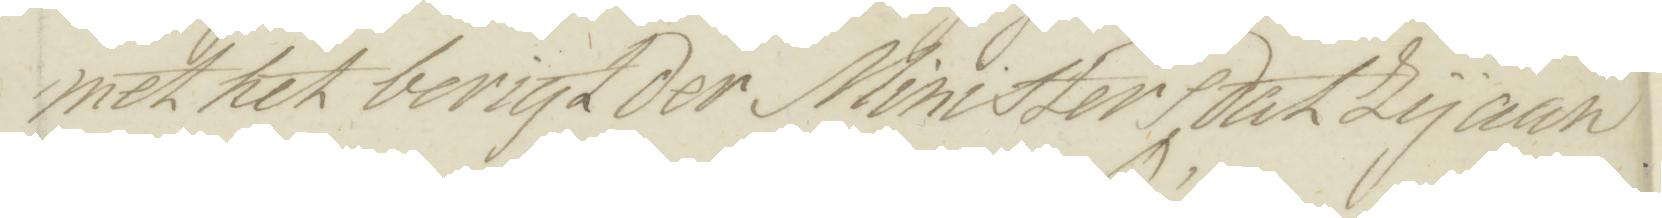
met het berigt der Ministers dat Zij aan
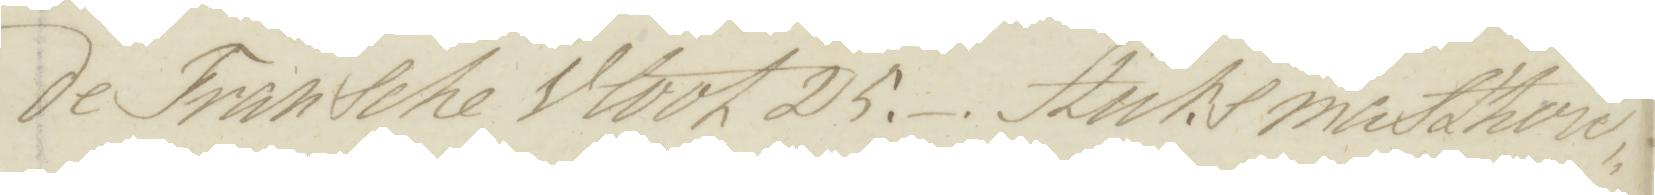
de Fransche Vloot 25.-. Stuks masthou„
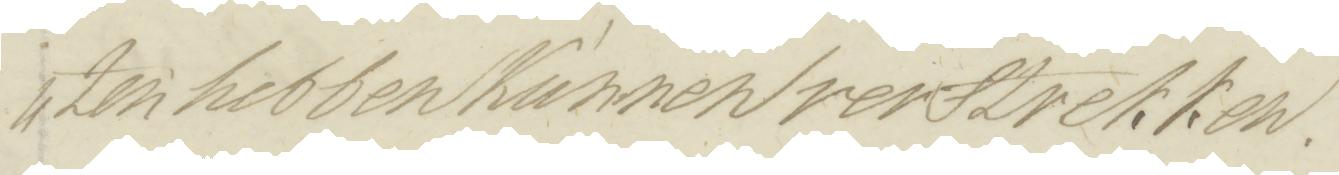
„ten hebben kunnen verstrekken.
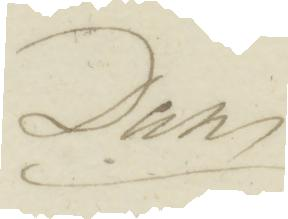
Dan
